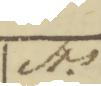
st.s
